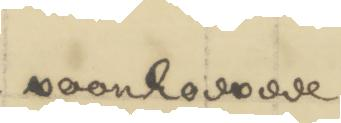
voor hoeveel
